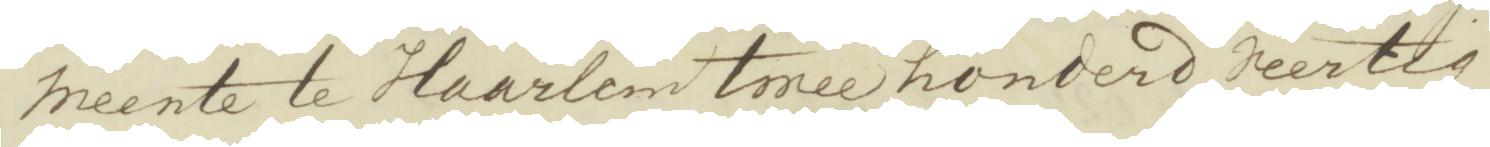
meente te Haarlem twee honderd veertig
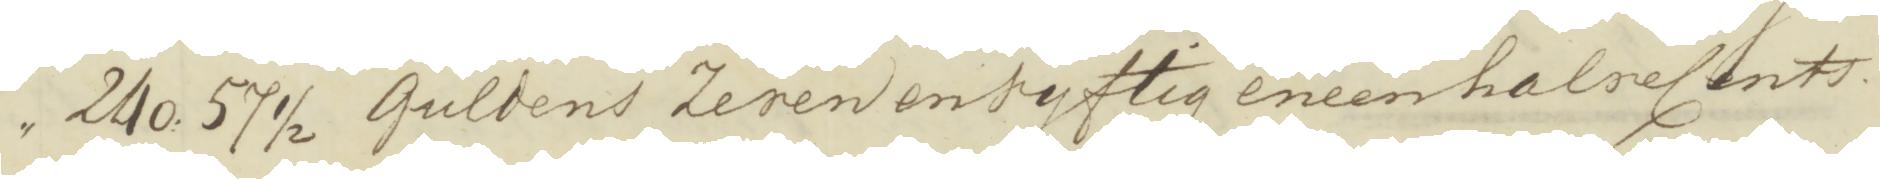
„ 240:57½ Guldens Zeven en vyftig en een halve Cents.
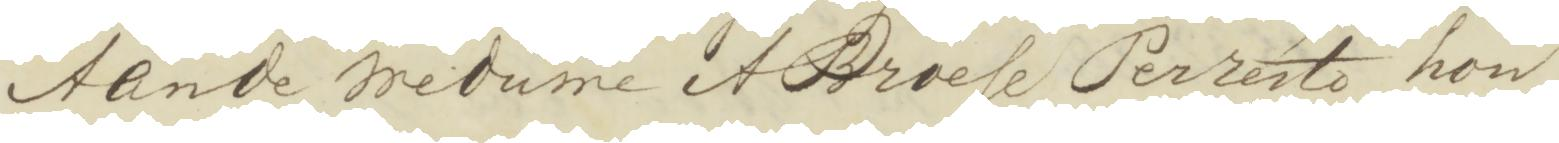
Aan de weduwe A Broese Per resto hon
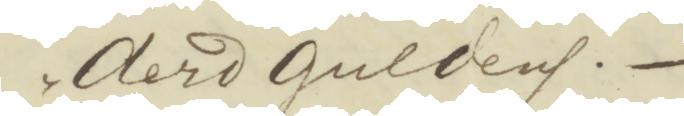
„derd guldens.-
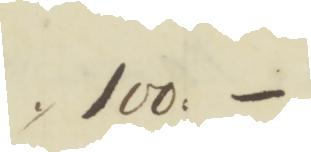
„ 100: —
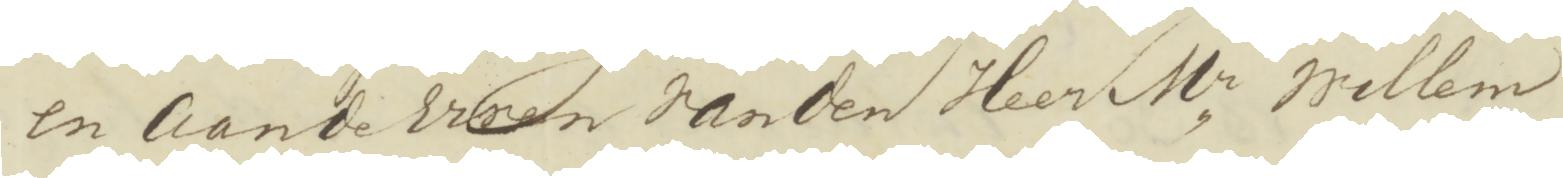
en Aan de Erven van den Heer M„r Willem
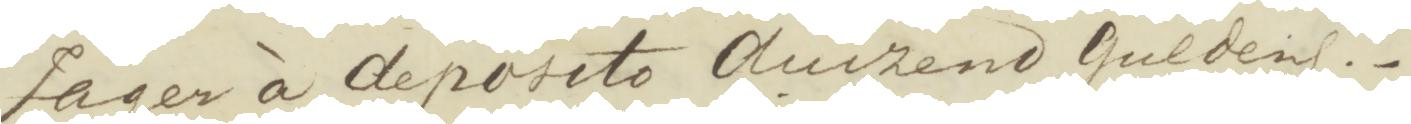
Jager à deposito duizend guldens.-
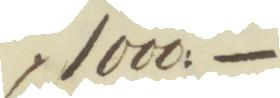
1000: —
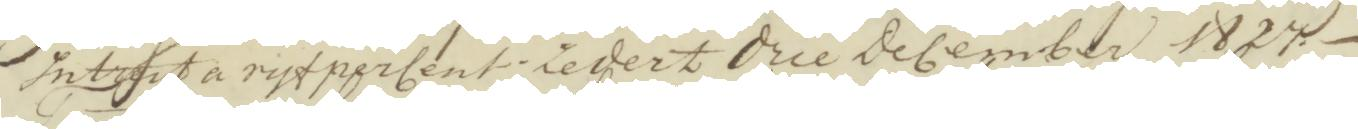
Intrest à vyf perCent - zedert drie December 1827.—
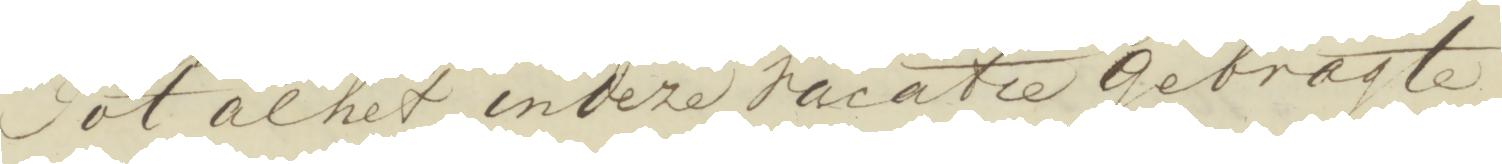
Tot alhet in deze vacatie gebragte
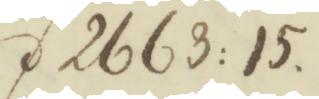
ƒ 2663:15.
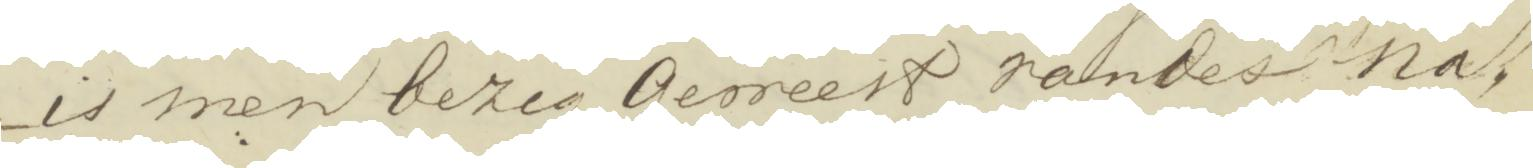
is men bezig geweest vandes na„
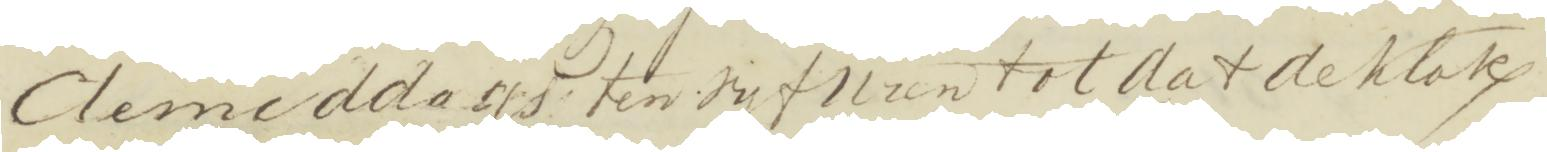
demiddags ten vijf Uren tot dat de klok
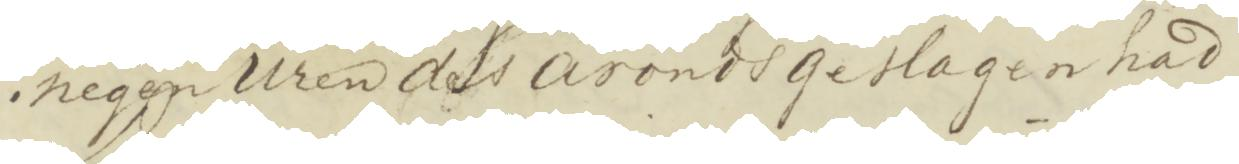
„negen Uren des avonds geslagen had
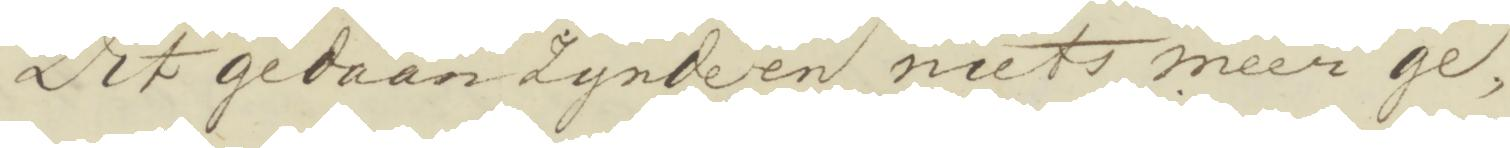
Dit gedaan zynde en niets meer ge„
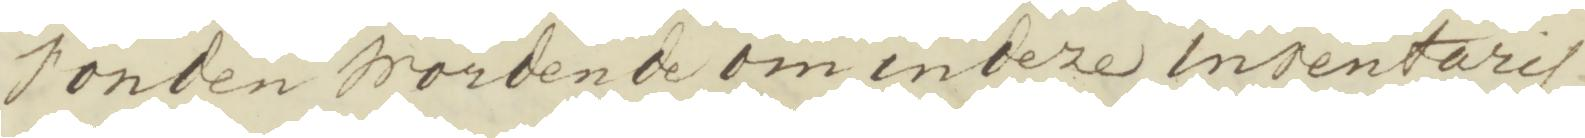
vonden wordende om in deze inventaris
